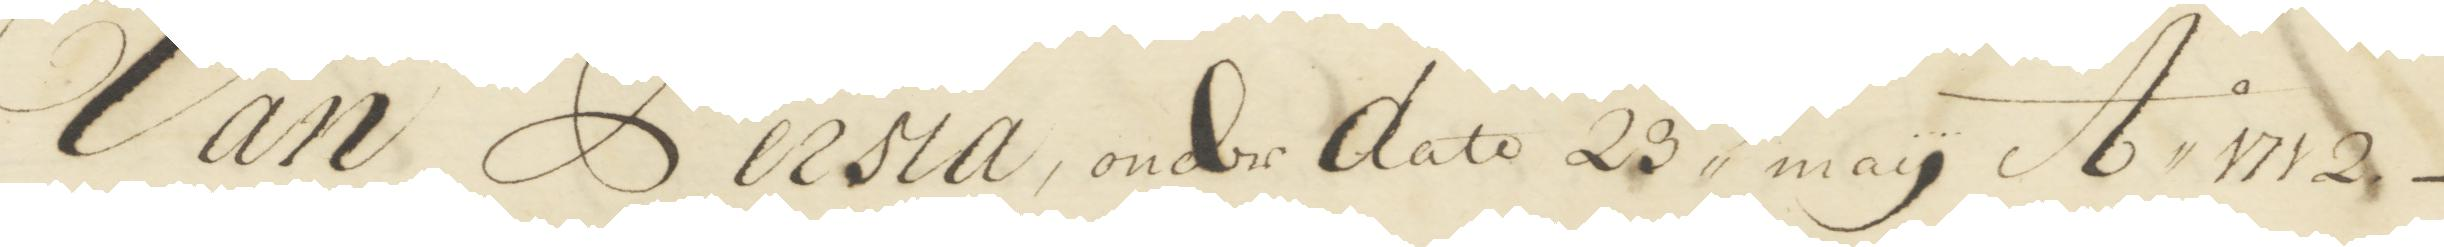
Van Persia, onder dato 23„' maij A„o 1712.—
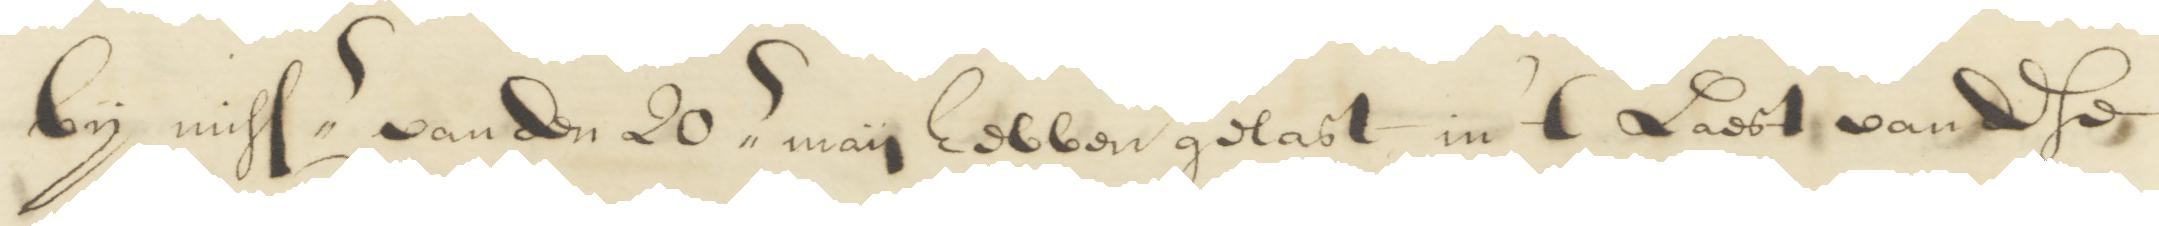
bij miss„e van den 20„e maij hebben gelast in ’t Laest van dese
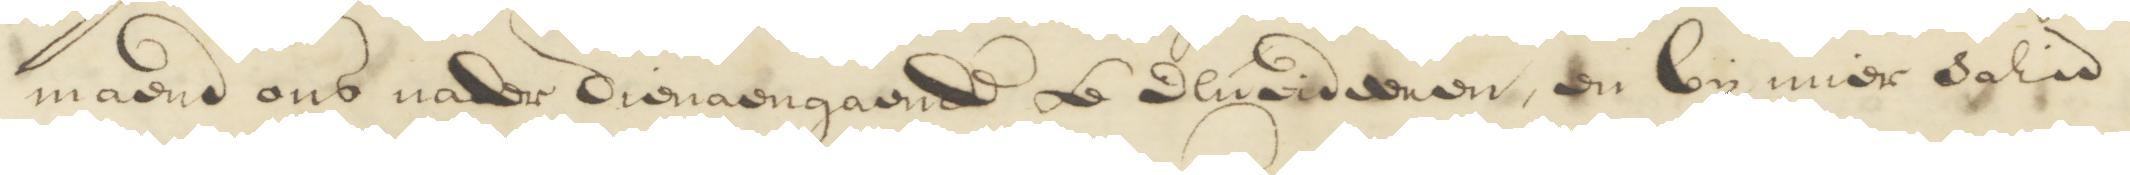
maend ons nader dienaengaende te Elucideeren, en bij mier sahid
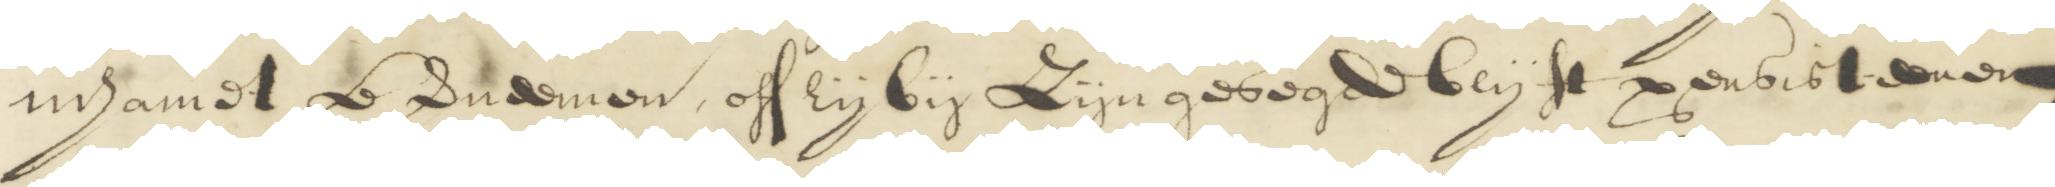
inhamet te verneemen, off hij bij Zijn gesegde blijft persisteeren,
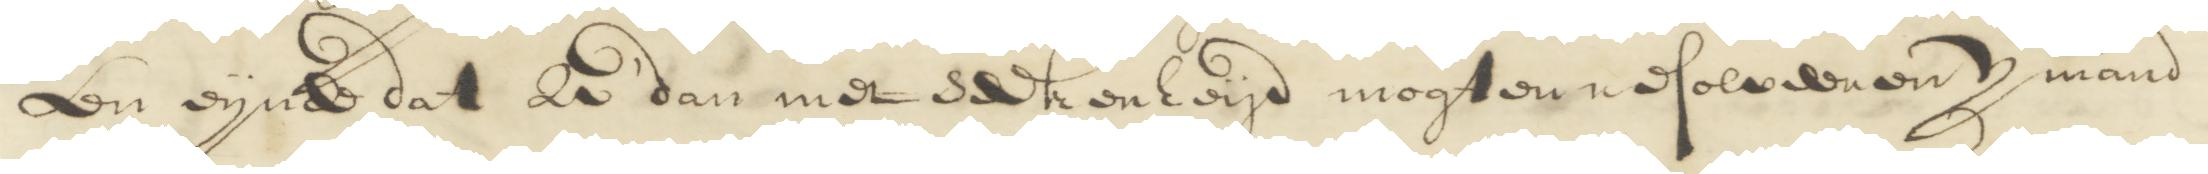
ten eijnde dat w' dan met seekerheijd mogten resolveeren ymand
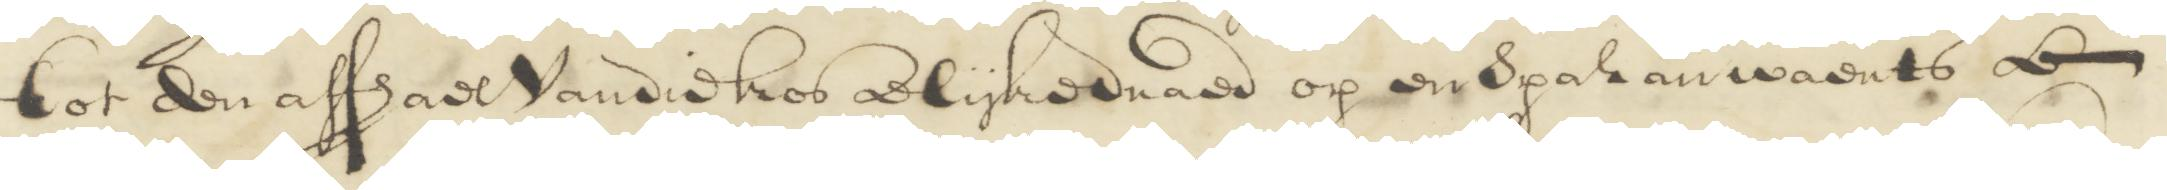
tot den affhael van die kostelijke draed op enspahan waerts te
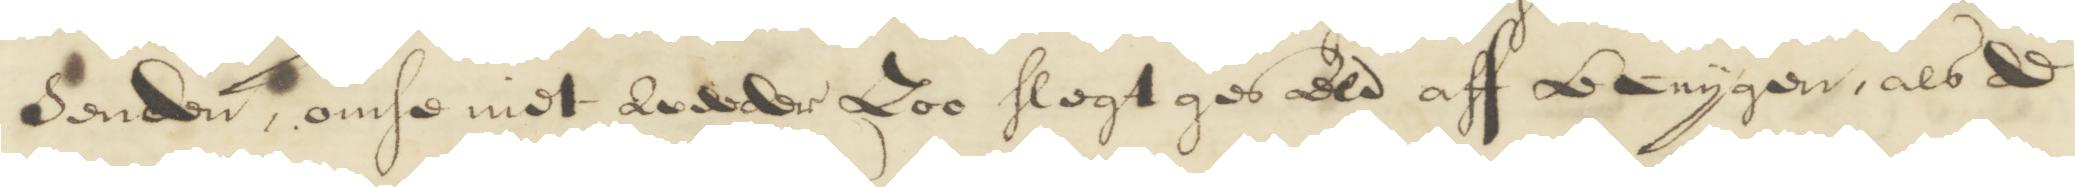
senden, omse niet weeder Zoo slegt gesteld aff te crijgen, als de
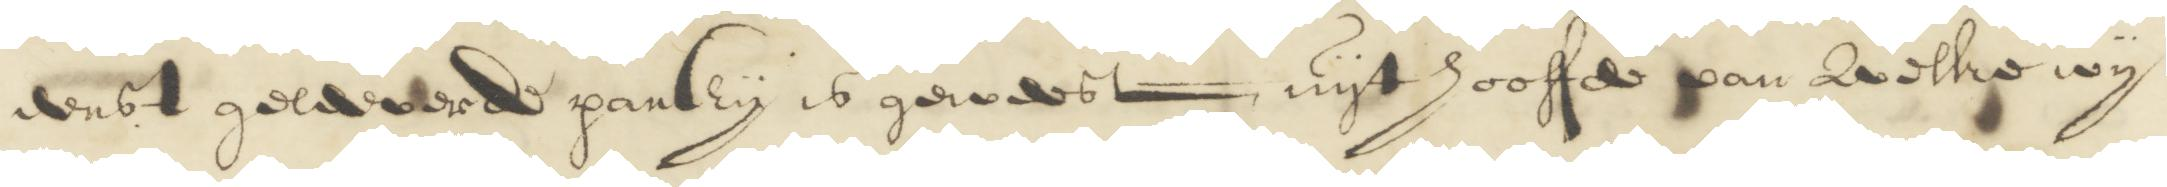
eerst geleeverde parthij is geweest, uijt hooffde van welke wij
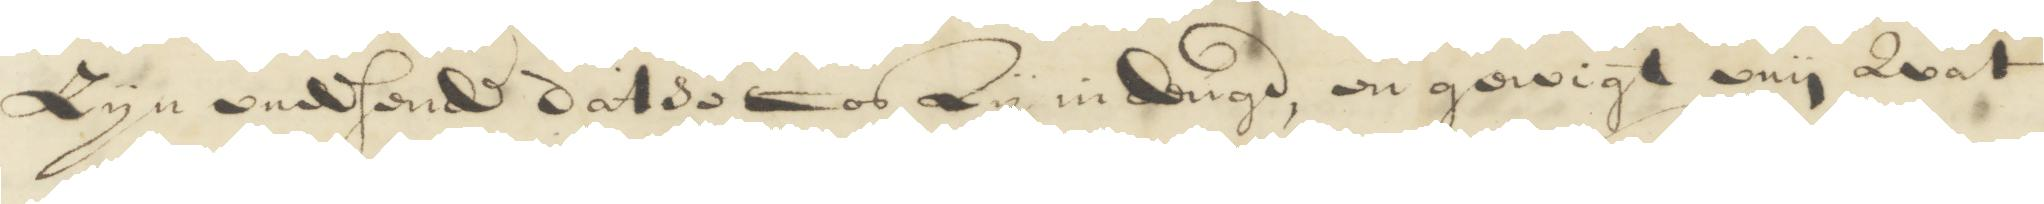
Zijn vreesende dat se Costij in deugd, en gewigt vrij wat
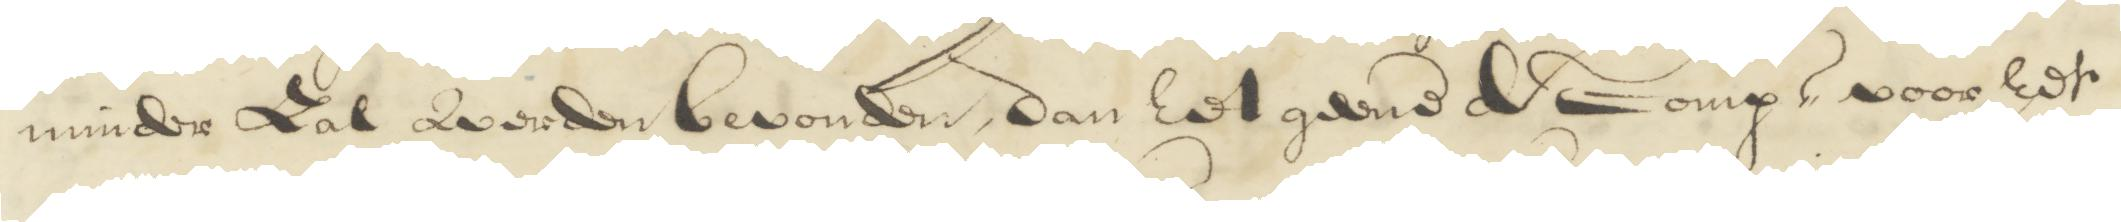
minder Zal werden bevonden, dan het geene dE Comp„e voor het
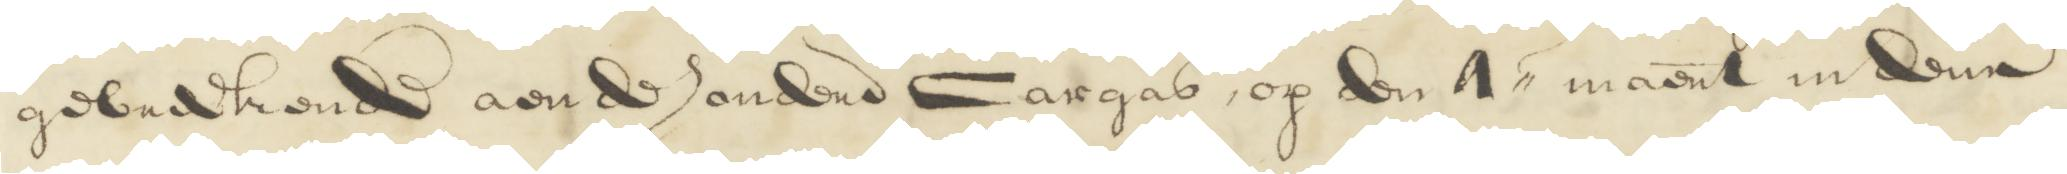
gebreekende aen de honderd Cargas, op den 4„' maert in dese
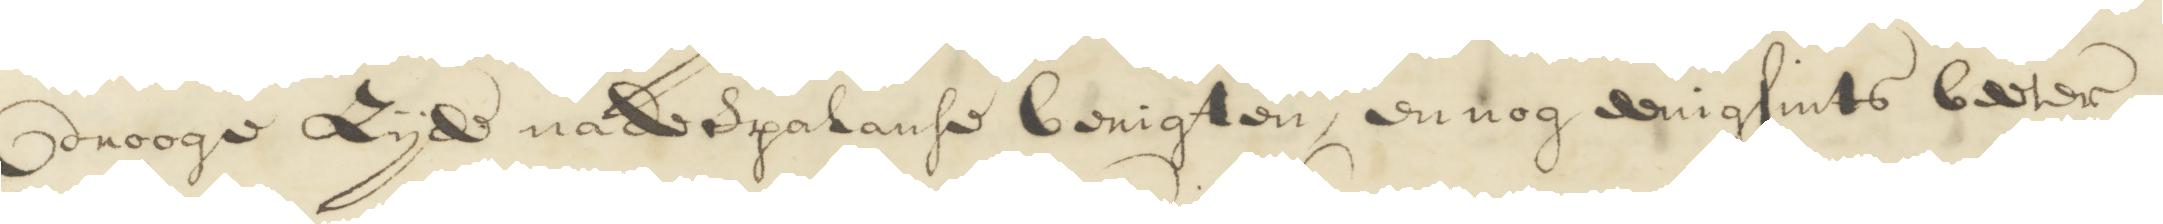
drooge Zijde na de spahanse berigten, en nog eenigsints beeter,
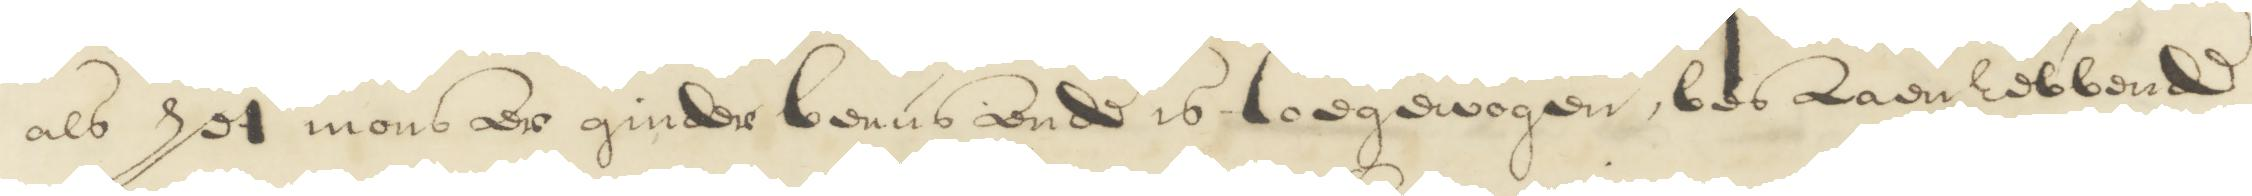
als het monster ginder berustende is toegewogen, bestaen hebbende
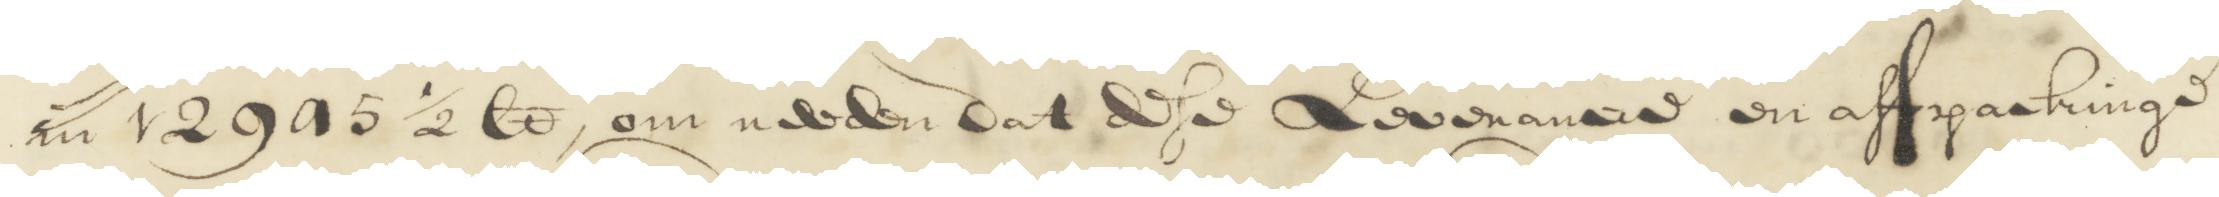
in 12945 ½ lb, om reeden dat dese Leverancie en affpackinge
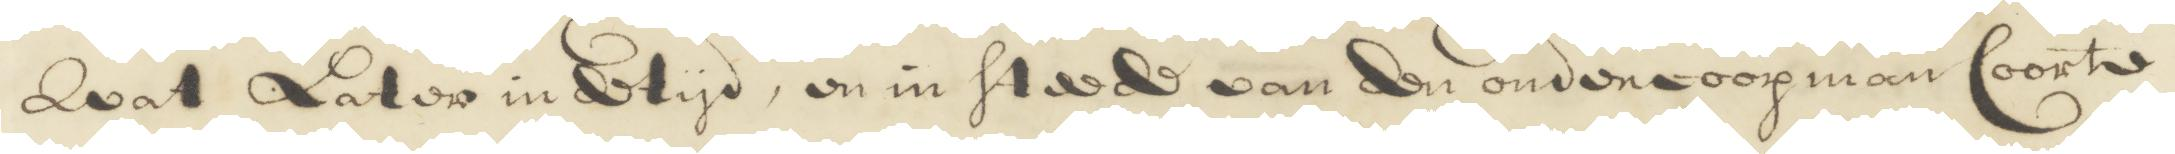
wat Later in detijd, en in steede van den ondercoopman Coorte
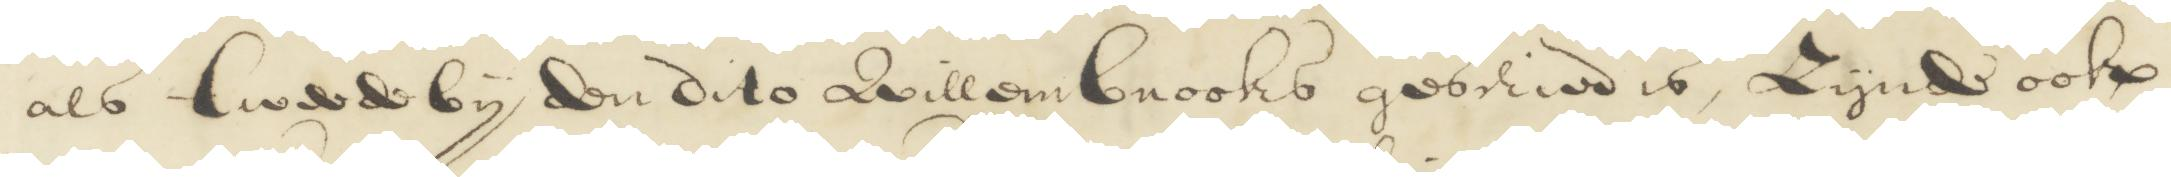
als tweede bij den dito willem brooks geschied is, Zijnde ook
